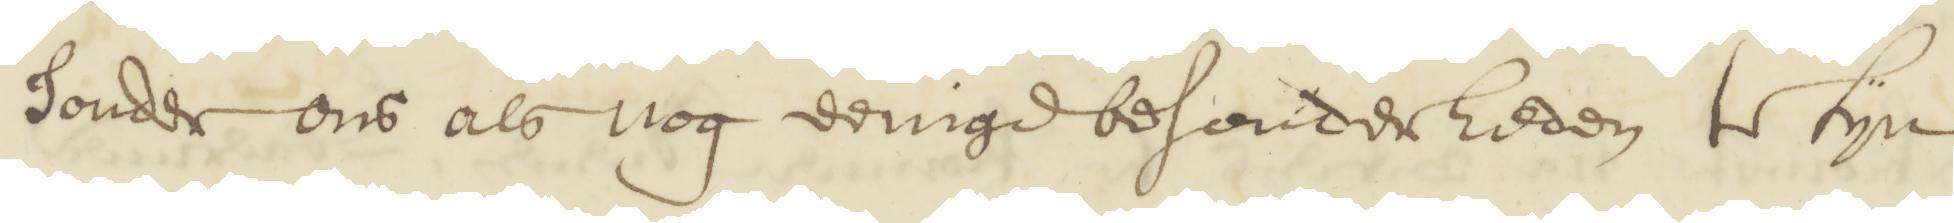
sonder ons als nog eenige besonder heden te sijn
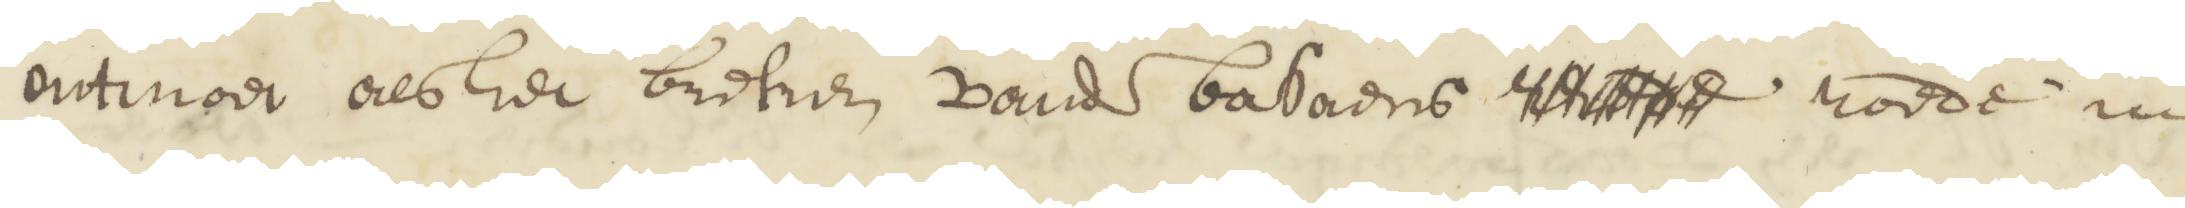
ontmoet als het breken vande basaens rhede roede in
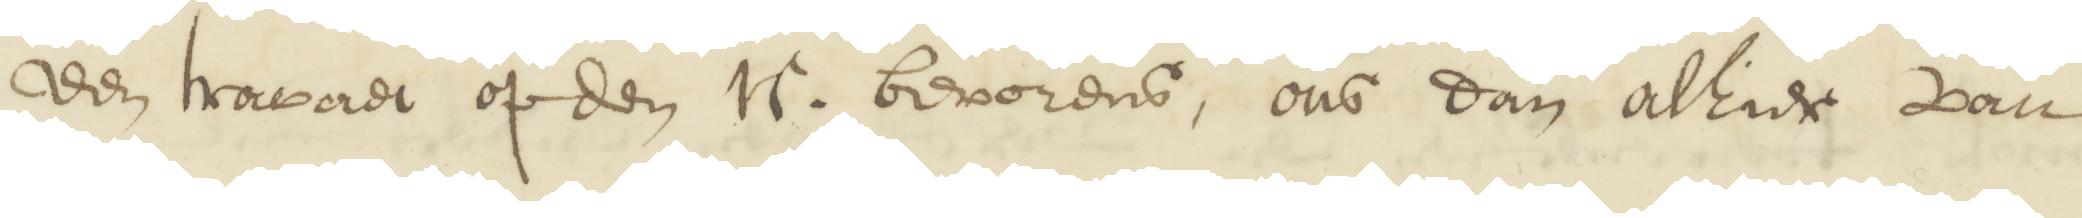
een travaet op den 15. bevorens, ons dan alhier van
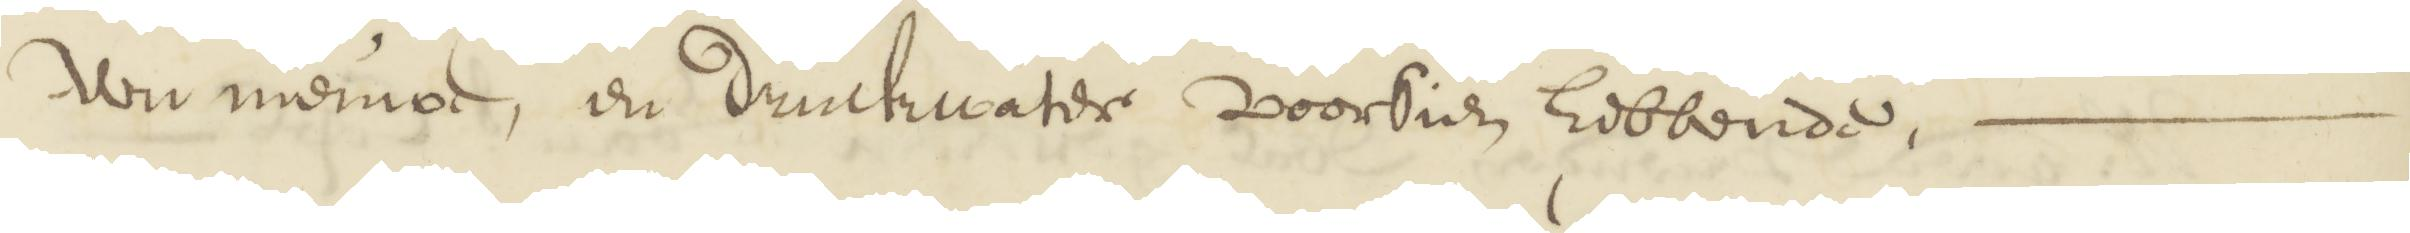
een nieuwe, en drinkwater voorsien hebbende, —
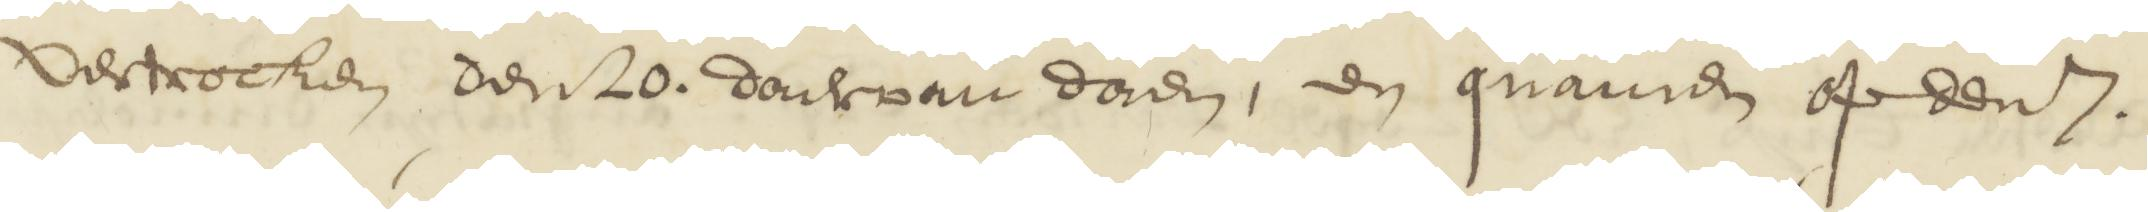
vertrocken den 20. daervan daen, en quamen op den 7.
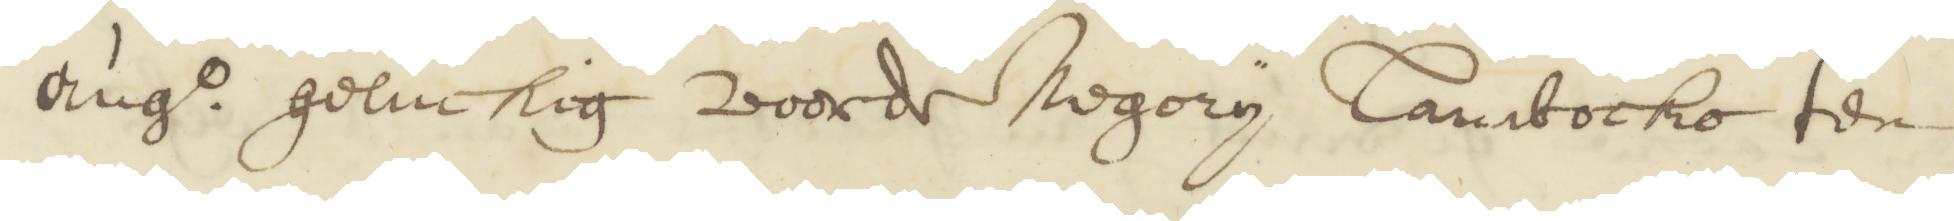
aug:o geluckig voor de negorij Tambocko ten
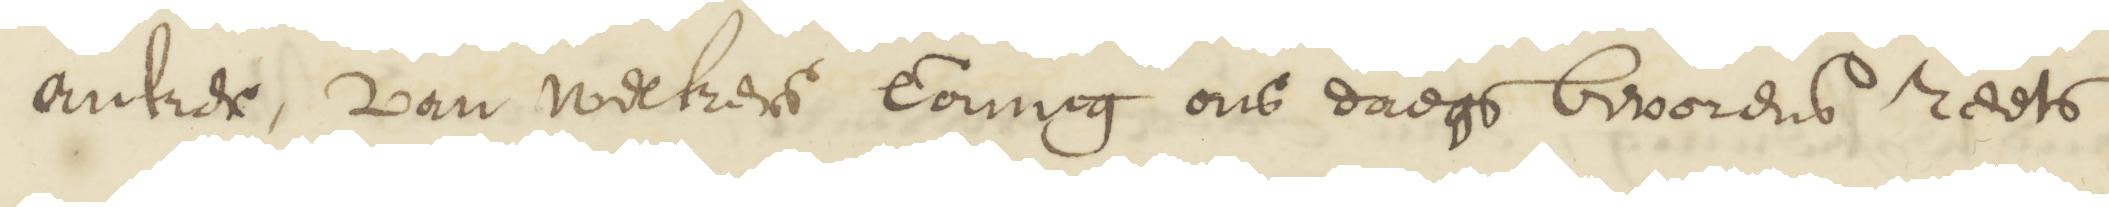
anker, van welkers Coning ons daegs bevorens reets
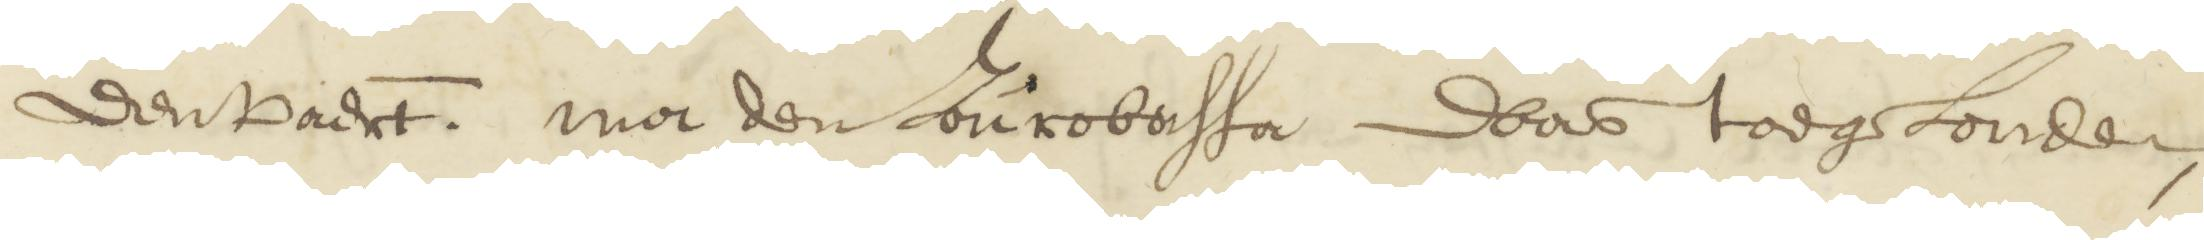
een vaert. met den Zourobassa was toegesonden,
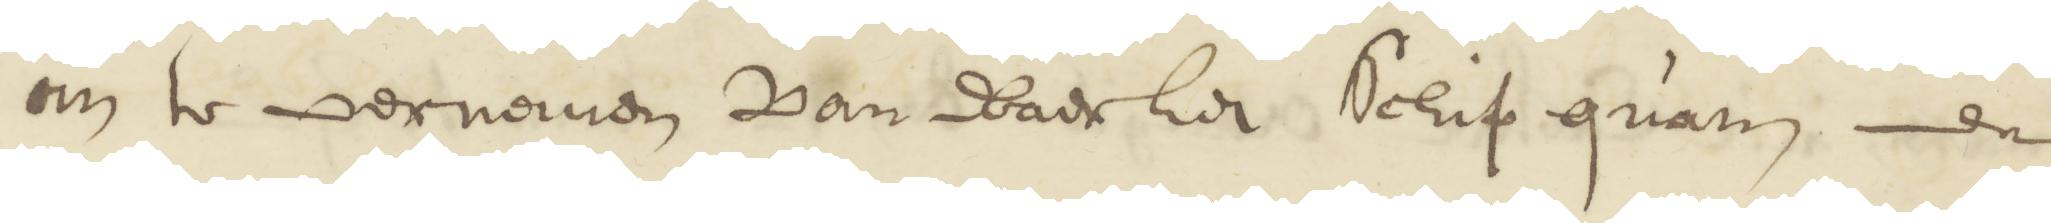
om te vernemen van waer het schip quam en
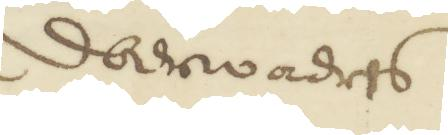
werwaerts
